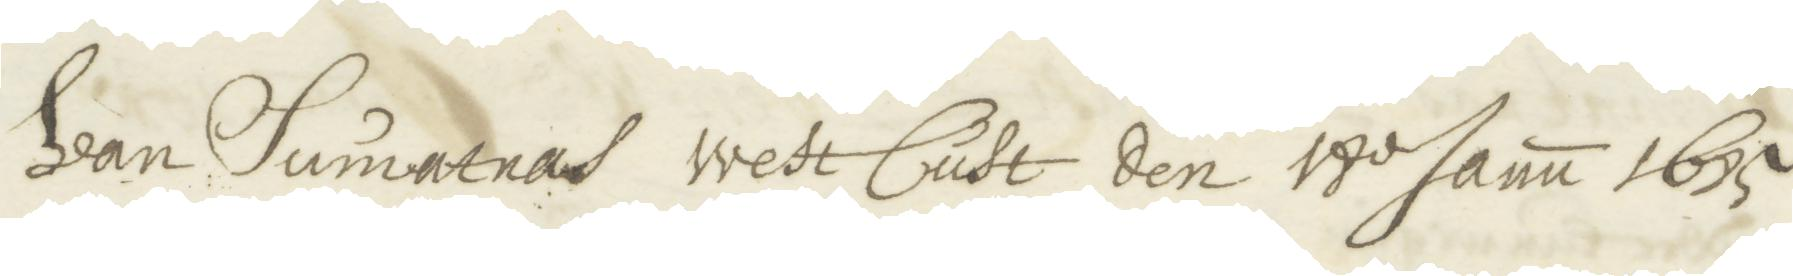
Van Sumatras west Cust den 18e Jann 1685.
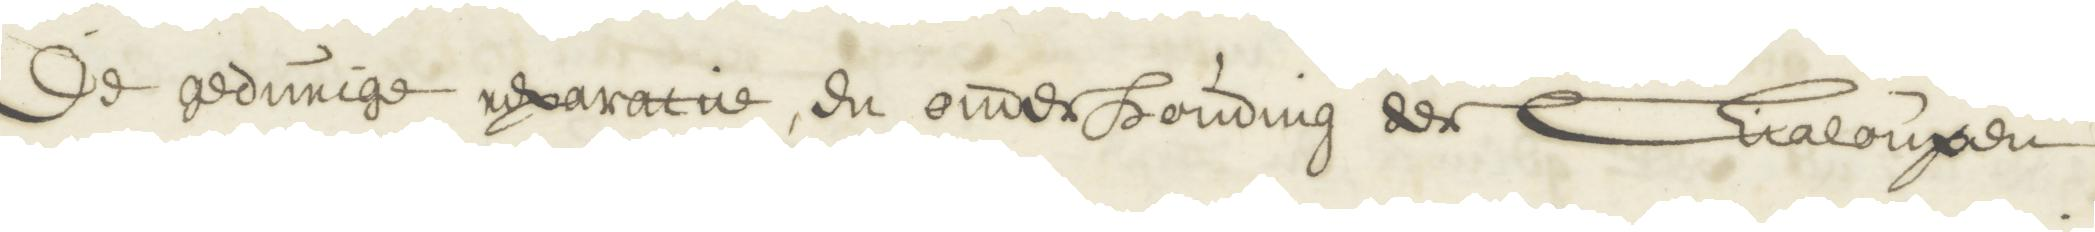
De gedurige reparatie, en onderhouding der Chialoupen
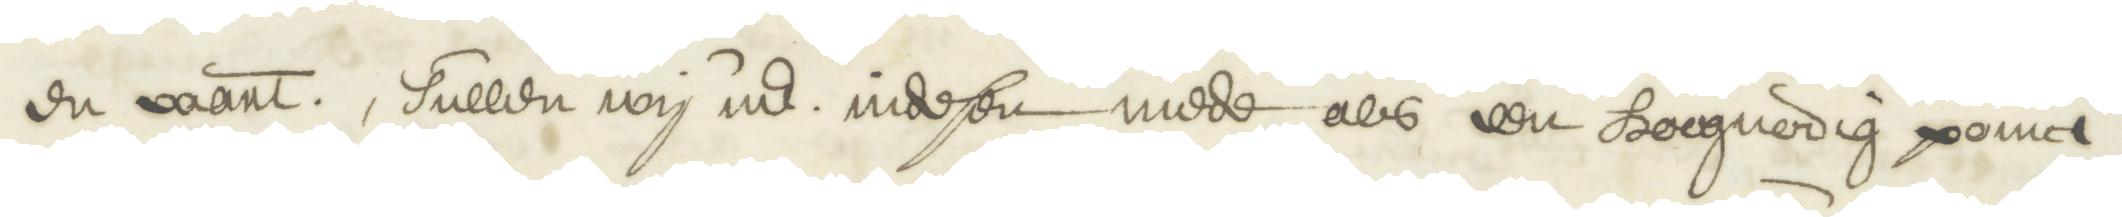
en vaart. , sullen wij uE. indesen mede als een hoognodig poinct
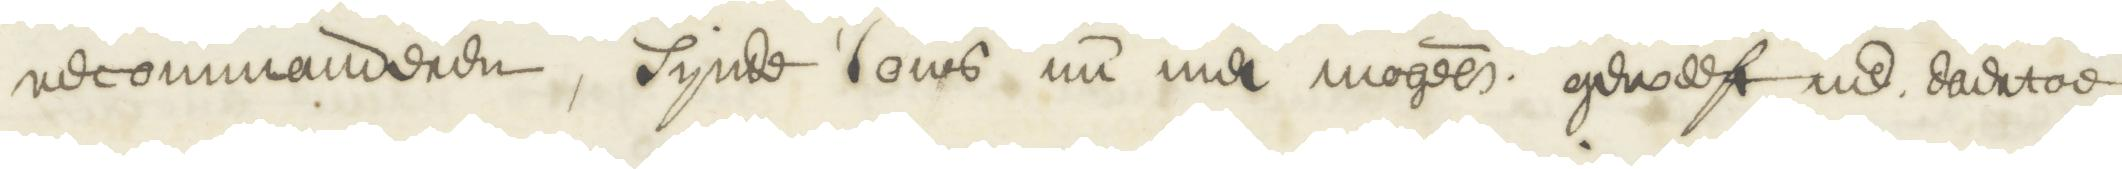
recommanderen, sijnde 't ons nu niet mogelijk geweest uE. daertoe
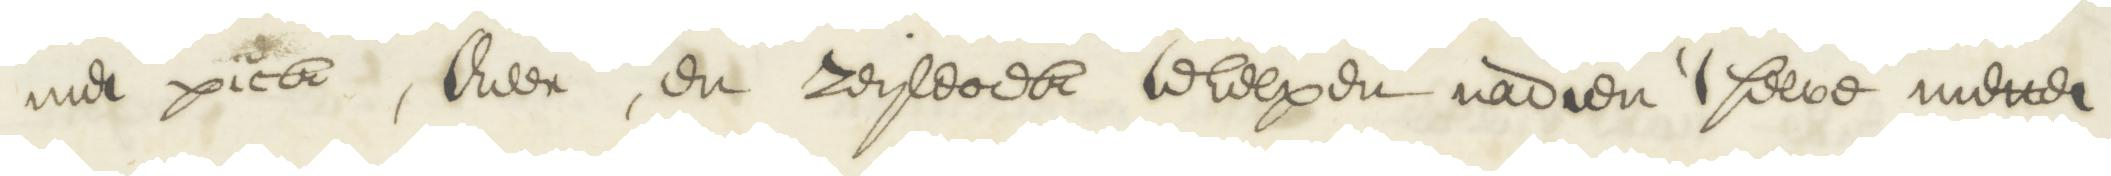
met pick, theer, en zeijldoek te helpen nadien 't selve mettet
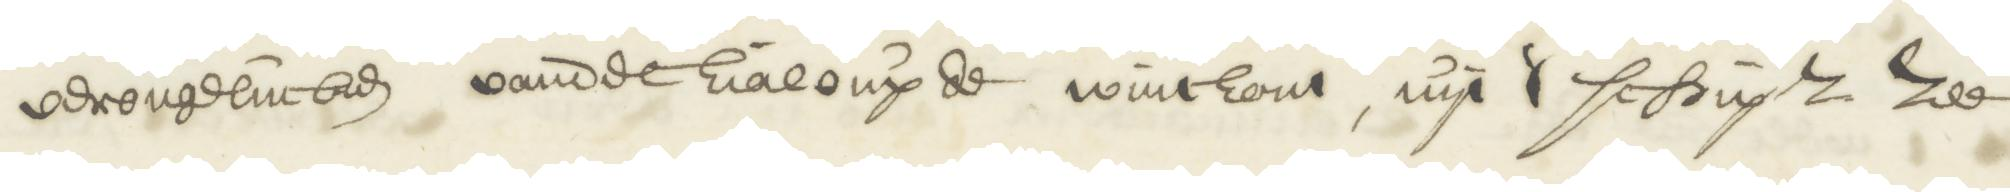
verongelucken vande chialoup de winthont, uijt 't schip Z. Zee
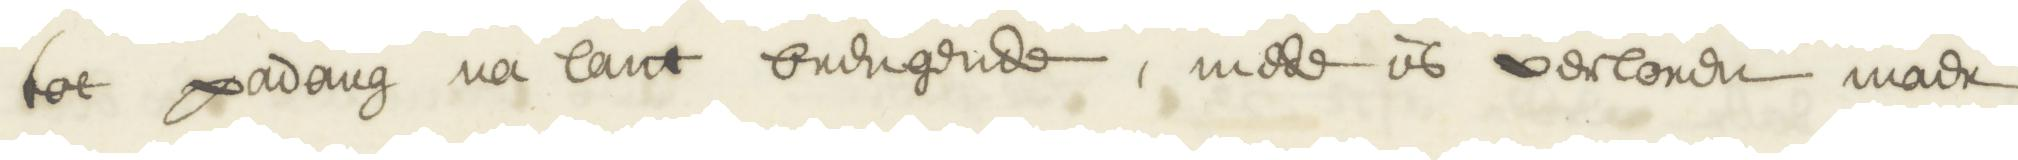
tot padang na lant brengende, mede is verloren maer
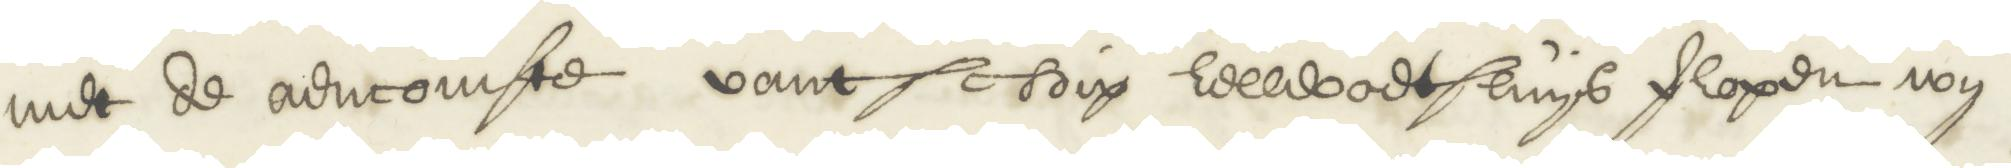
met de aencomste vant schip hellevoetsluijs verhopen wy
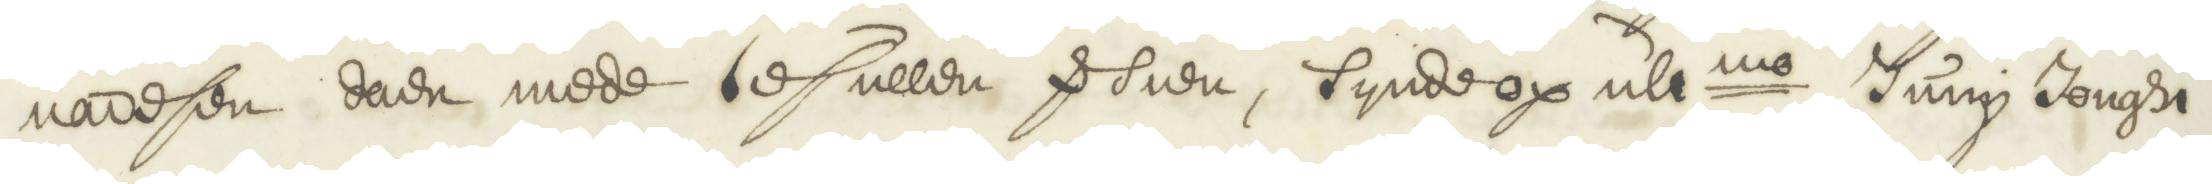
nadesen daer mede te sullen versien, synde op ult=mo Iunij Iongst
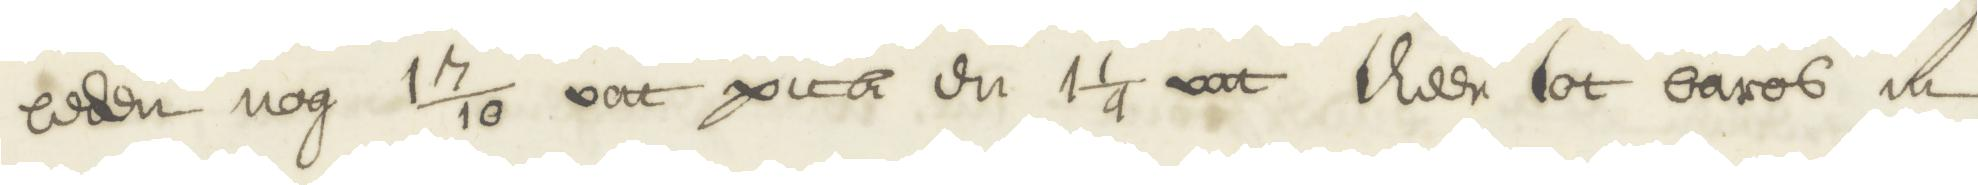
leden nog 1 7/10 vat pick en 1¼ vat theer tot baros in
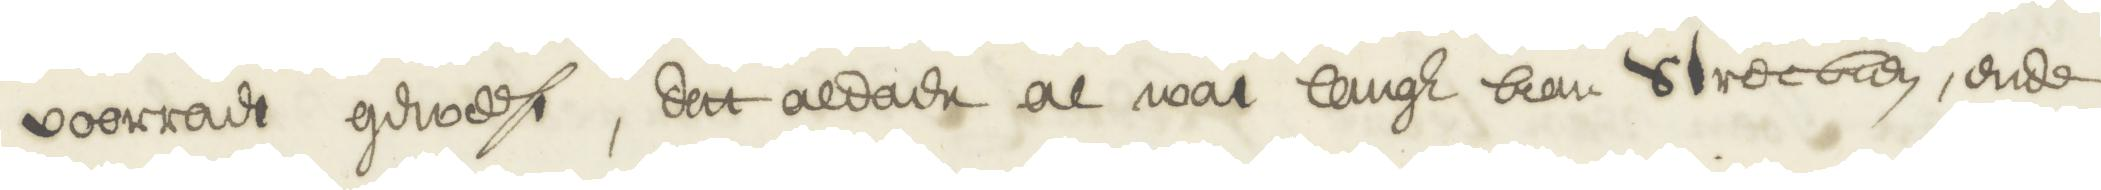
voorraet geweest, dat aldaer al wat langh kan strecken, ende
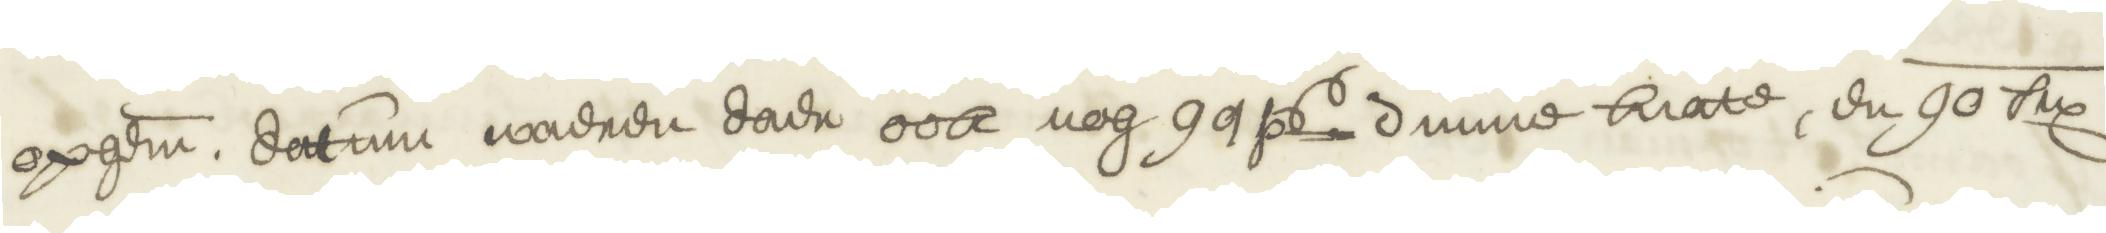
opgem: datum waeren daer ook nog 94 ps:s dunne kiate, en 9o stx
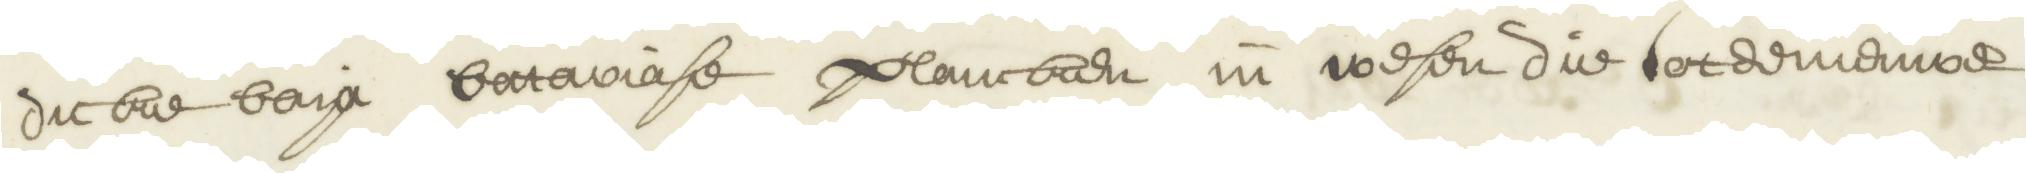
dicke baija bataviase plancken in wesen die tot denieuwe
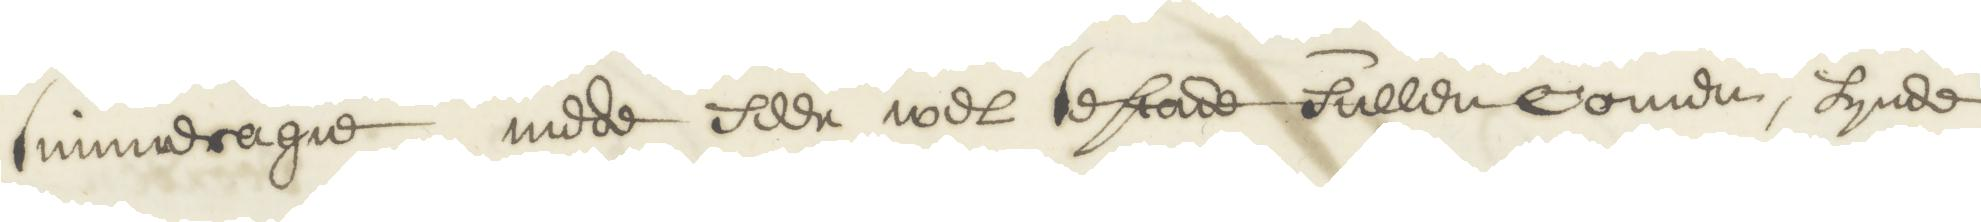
timmeragie mede seer wel te stade sullen comen, synde
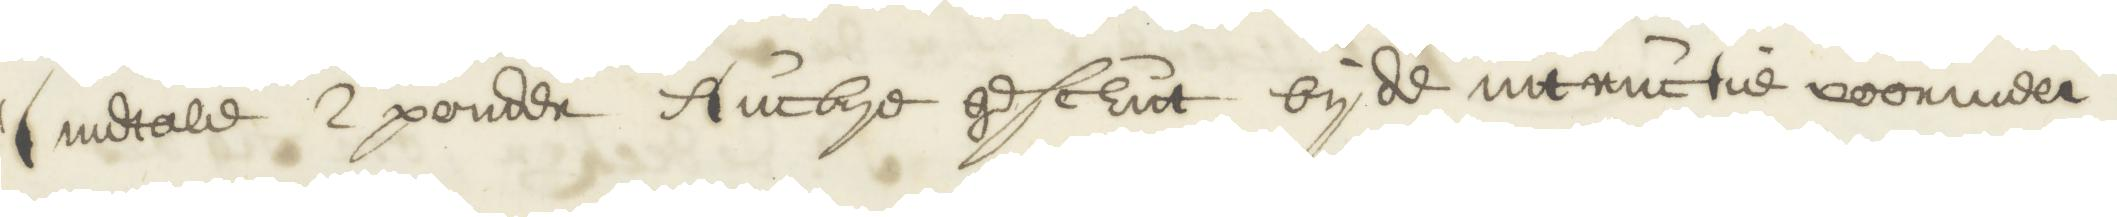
't metale 2 ponder stuckje geschut bij de intructie voormelt
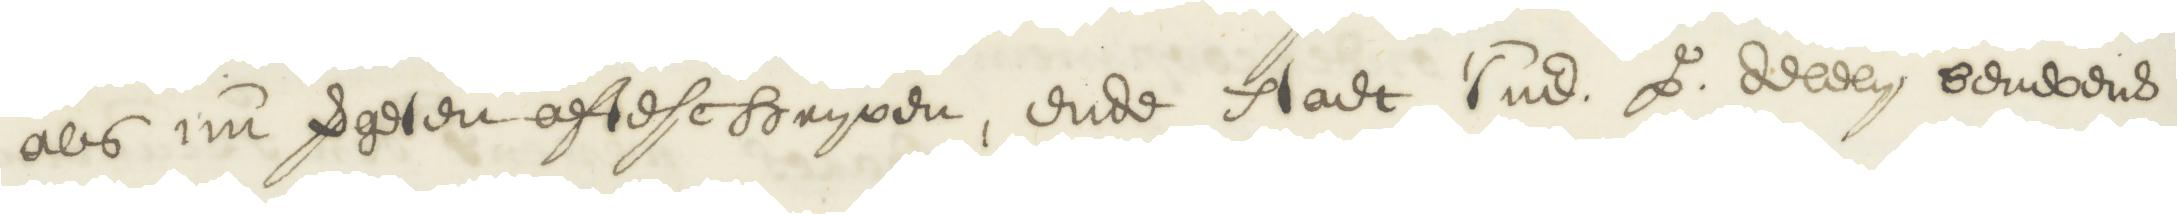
als nu vergeten af te schryven, ende staet 't uE. p.' delely benevens
